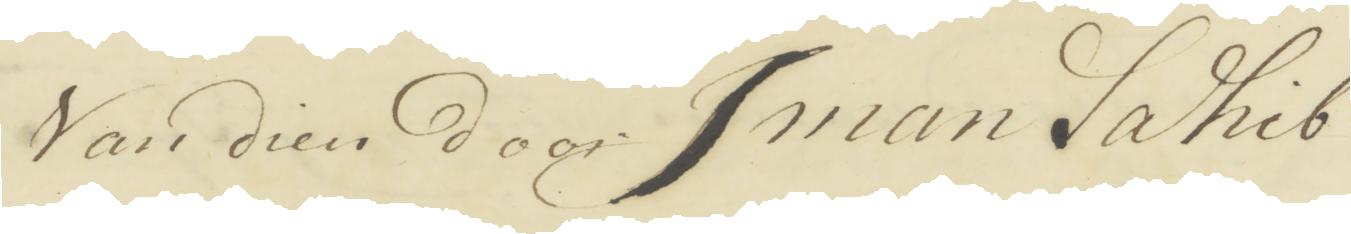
Van dien door Jman Sahib
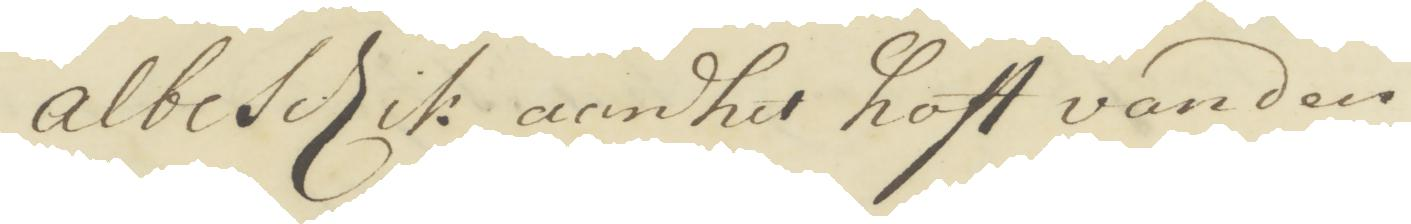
albeschik aan het hoft van den
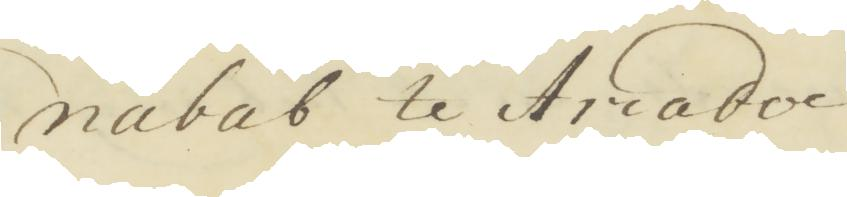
nabab te Ariadoe
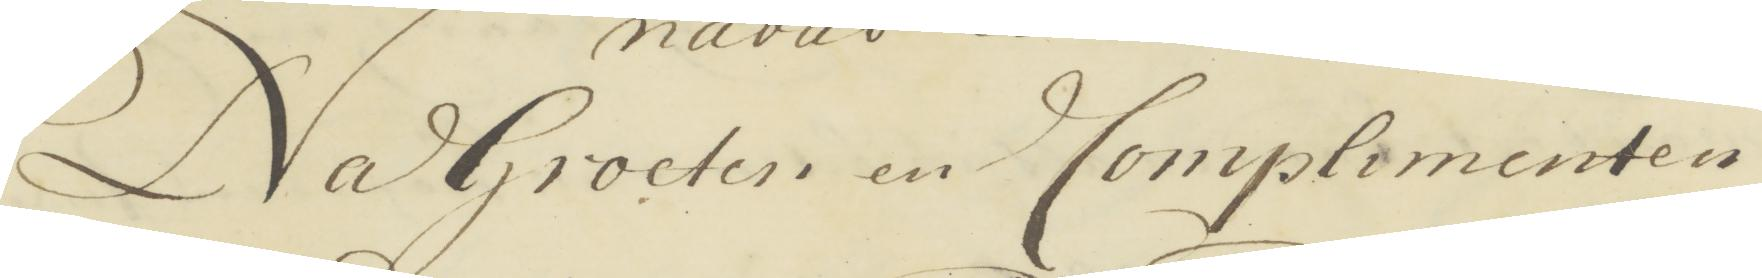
Na Groeten en Complimenten
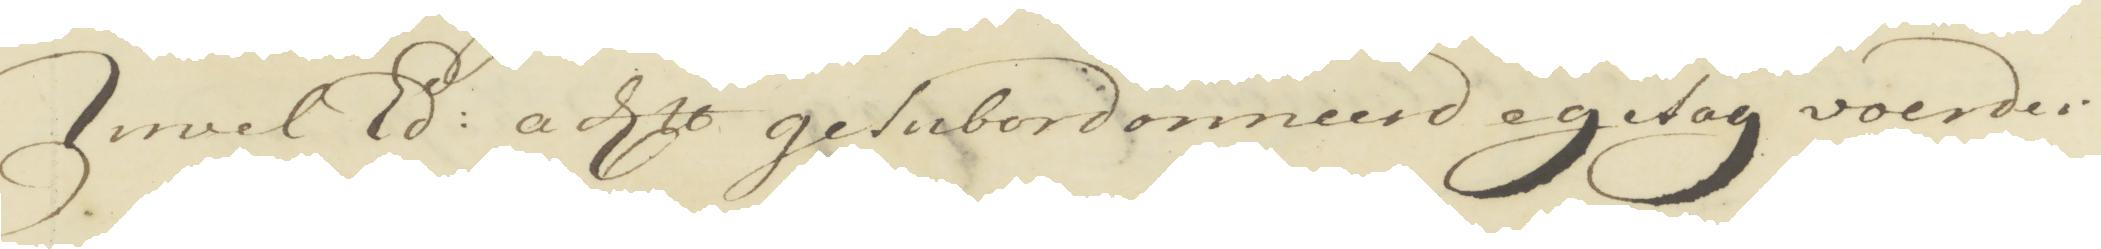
Uwel Ed: achtb gesubordonneerde gesag voerder
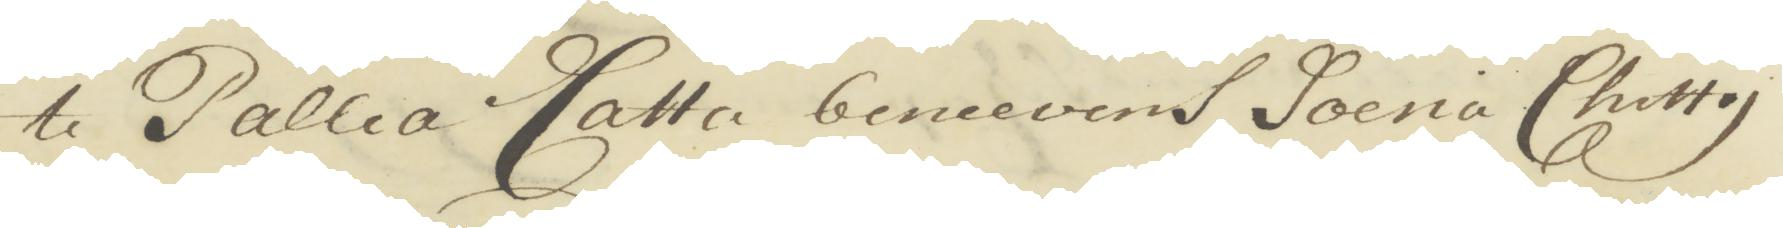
te Pallia Catta beneevens Soena Chittij
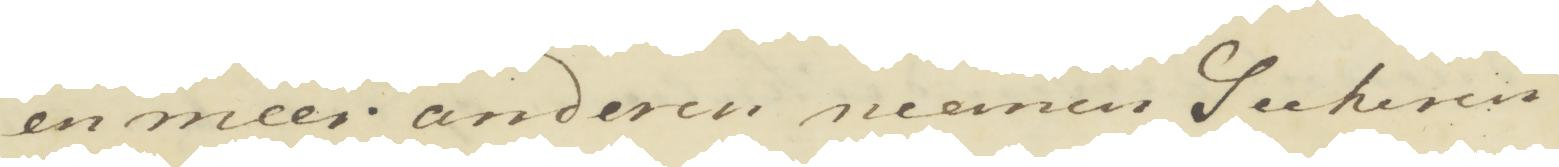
en meer anderen neemen seekeren
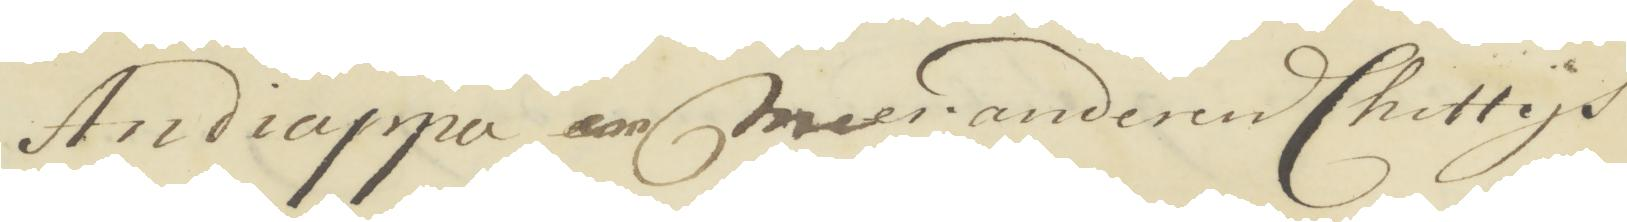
Andiappa en meer anderen Chittijs
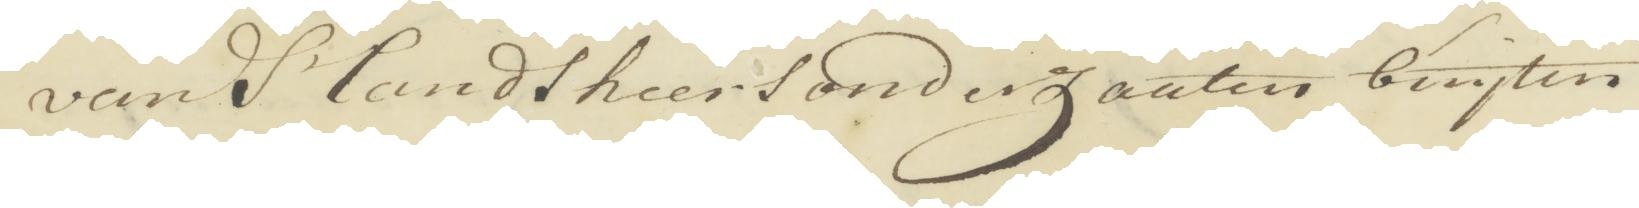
van s' lands heers onderzaaten buijten
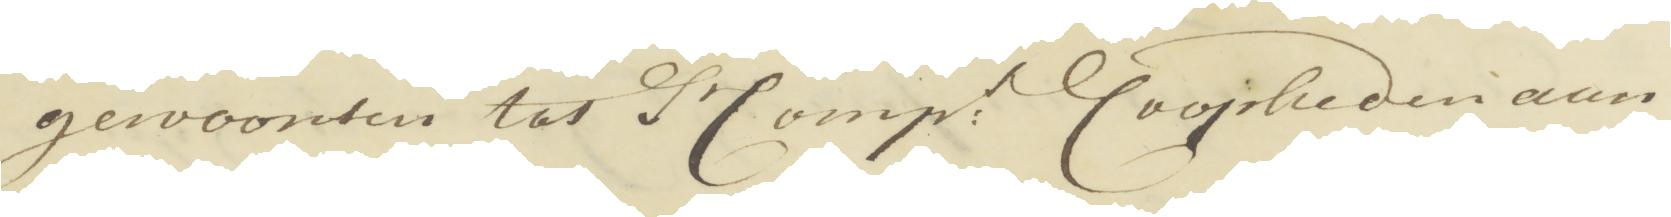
gewoonten tot s' Comp:s Cooplieden aan
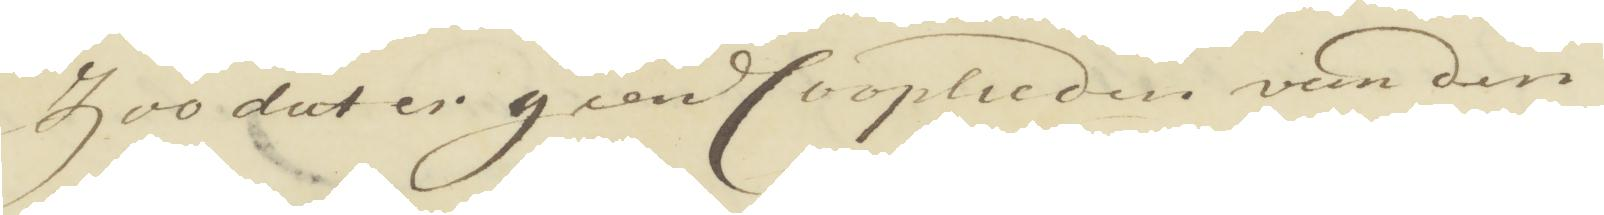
zoo dat er geen Cooplieden van den
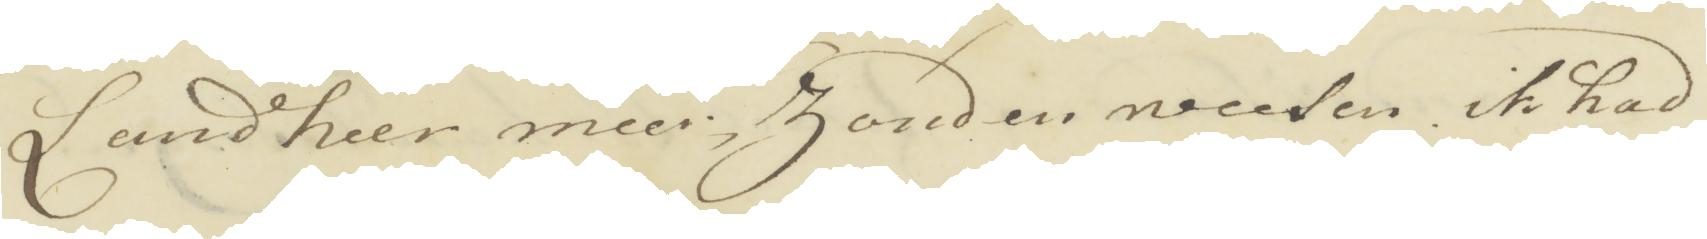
Landheer meer, zouden weesen. ik had
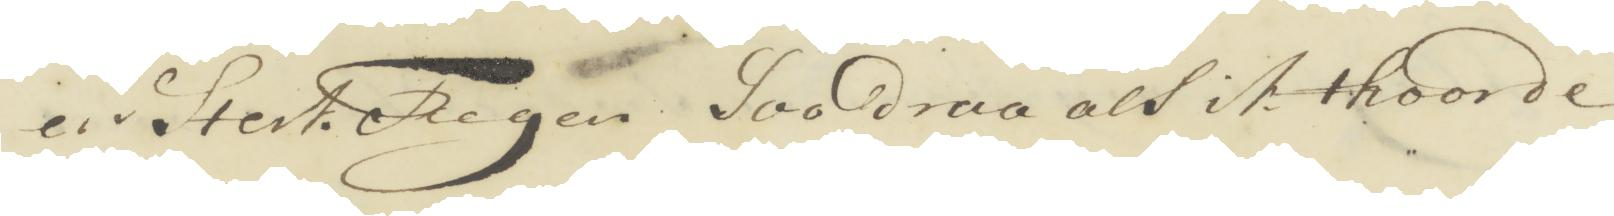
er sterk Tegen; soo draa als ik thoorde
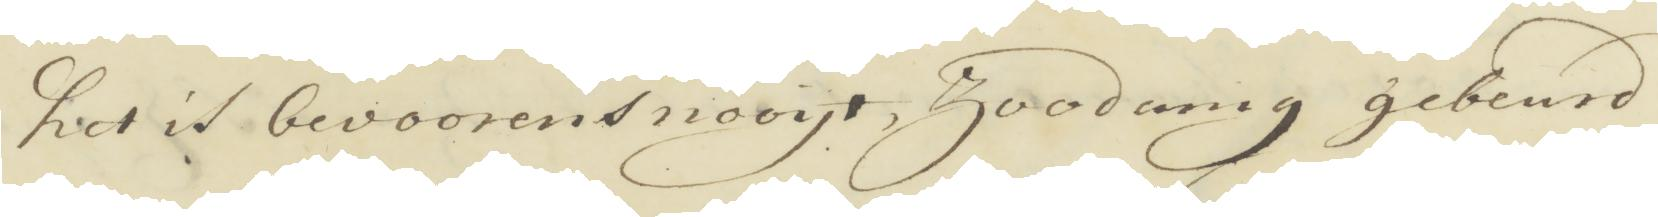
het is bevoorens nooijt, zoodanig gebeurd
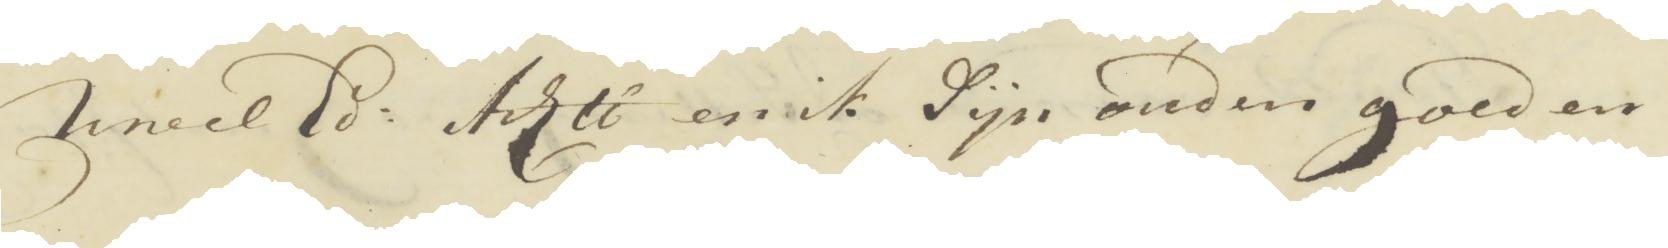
Uwel Ed: Achtb en ik sijn ouden goeden
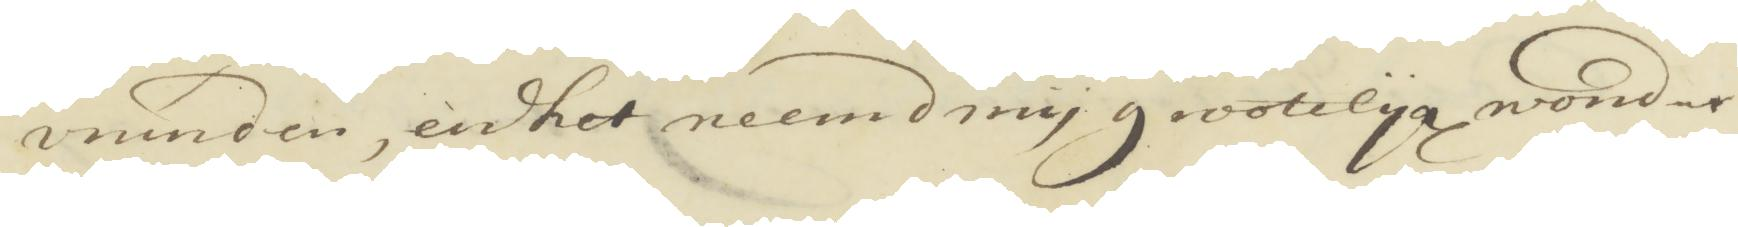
vrunden, en het neemd mij grootelijx wonder
